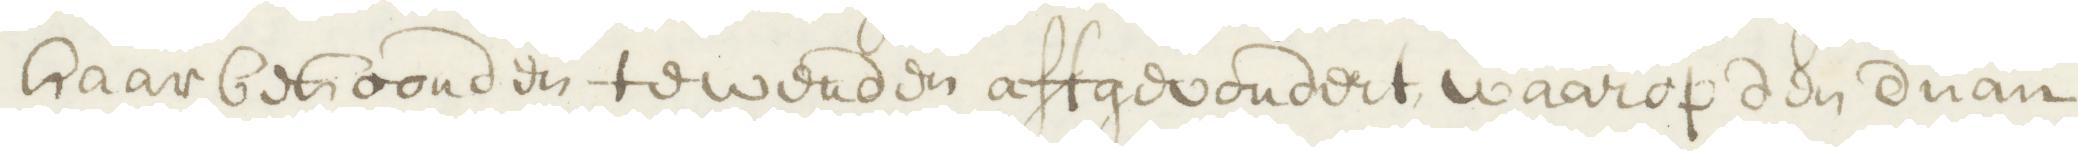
haar behoorden te werden affgevordert, waarop den duan
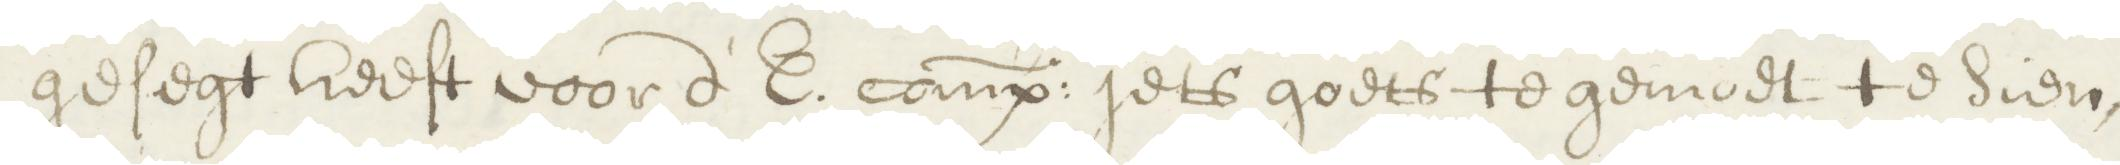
gesegt heeft voor d’ E. comp: jets goets te gemoet te sien,
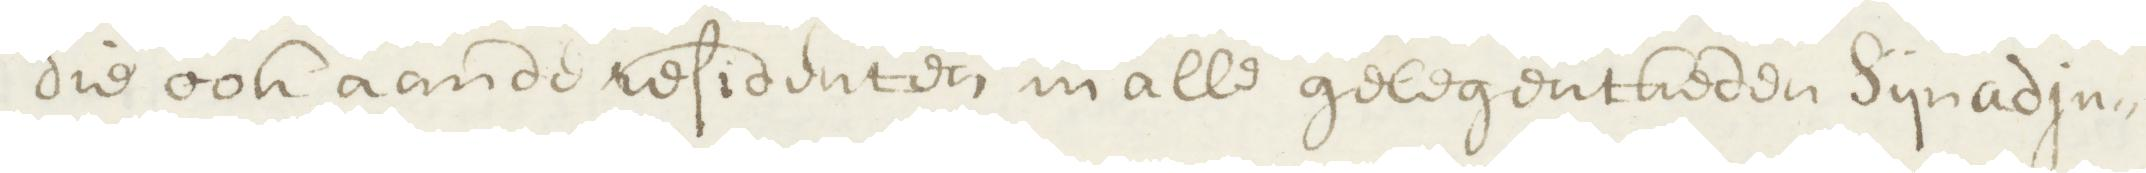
die ook aan de residenten in alle gelegentheden sijn adju„
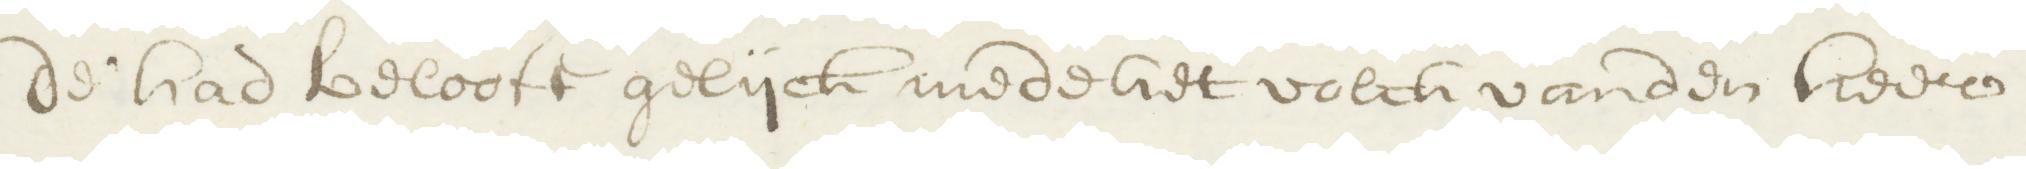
de had belooft gelijck mede het volck van den heer
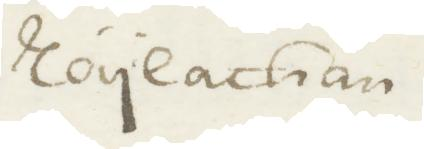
roijlachan
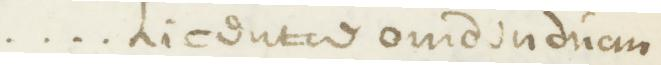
Licentie om den duan
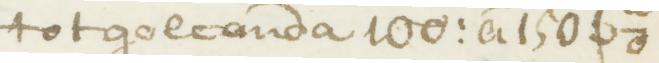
tot golcanda 100: á 150 p a/o
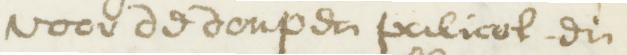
voor de dorpen palicol en
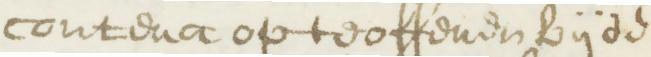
contera op te offeren bij de
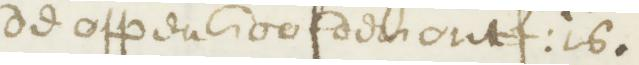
de opperhoofden ontf: is.
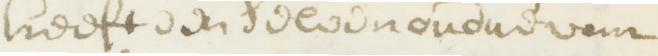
heeft een selven ordre van
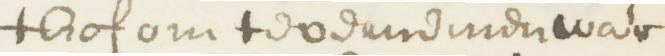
thof om te vernemen waer
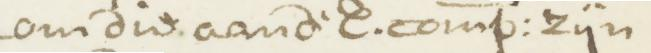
om die aan d’ E. comp: zijn
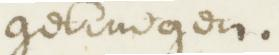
gekregen.
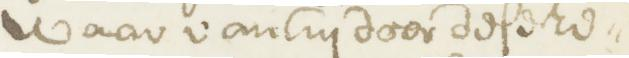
waar van hij door dese re„
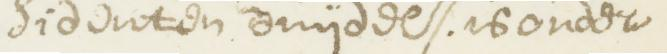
sidenten duijdelijk. is onder
